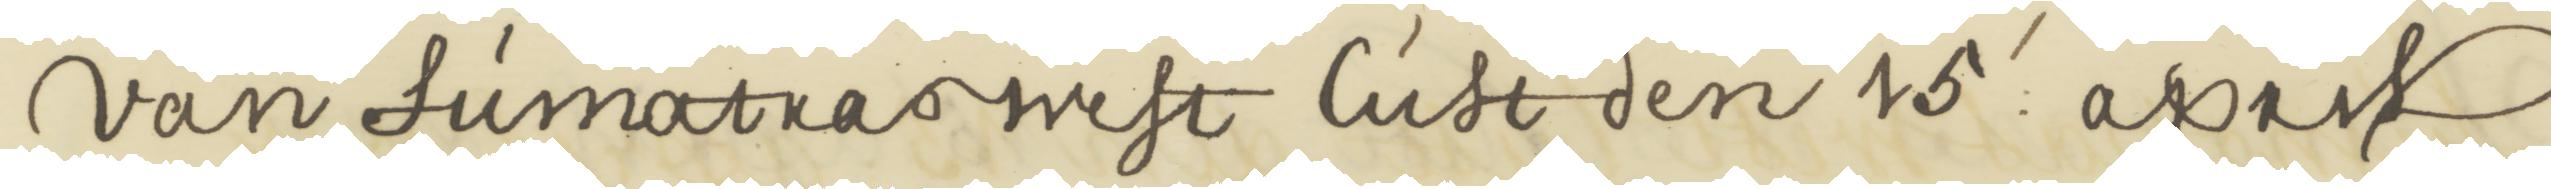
van Sumatras west cust den 15:' april 1717.
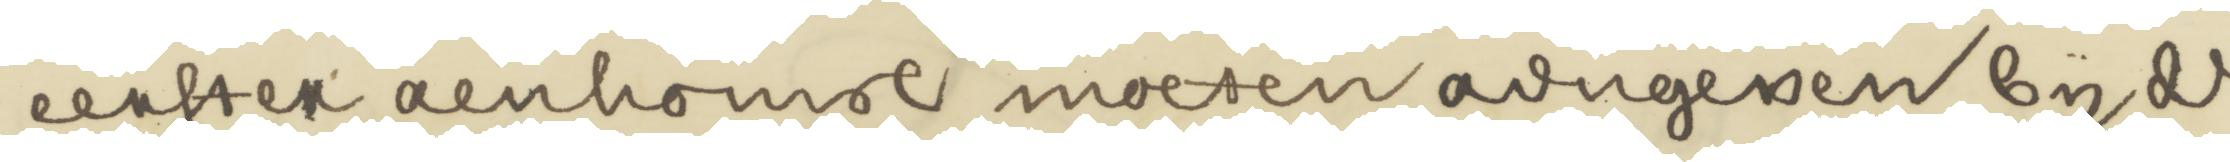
eerster aenkomst moeten aengeven bij de
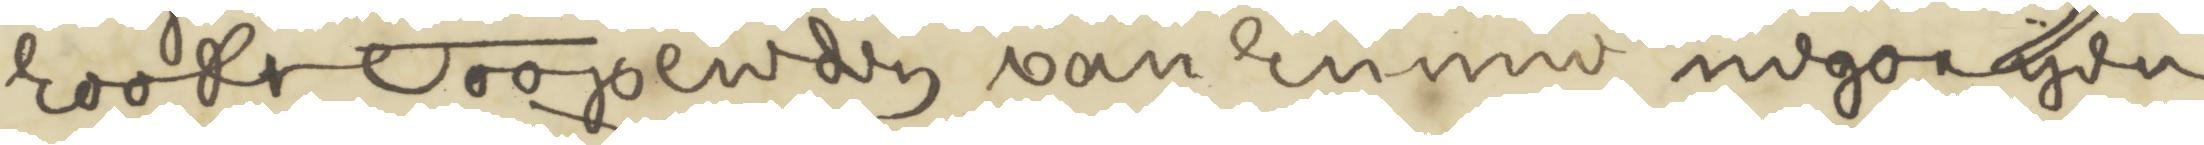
hooft Cooplieden van hunne negorijen
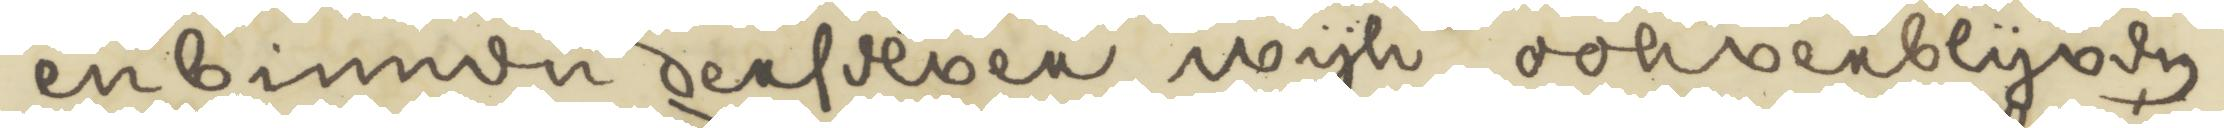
en binnen derselver wijk ook verblijven
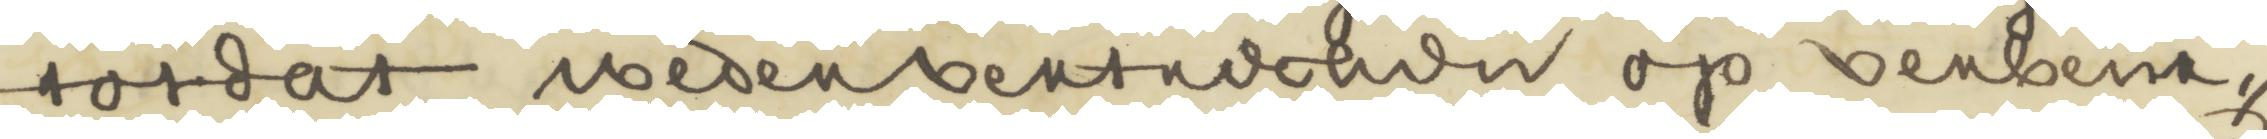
totdat weder vertrecken op verbeur„
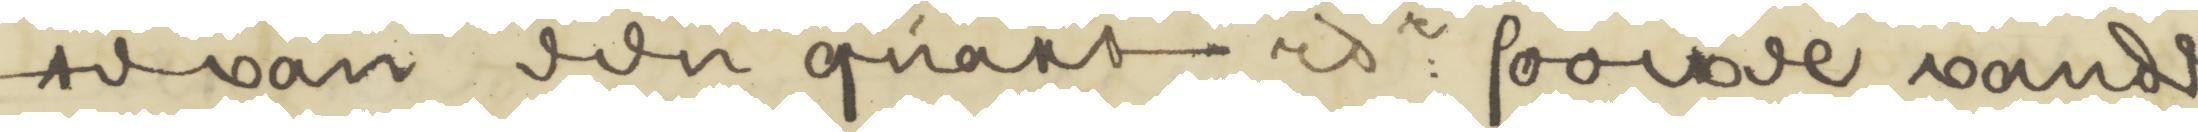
te van een quart rd:r soowel van de
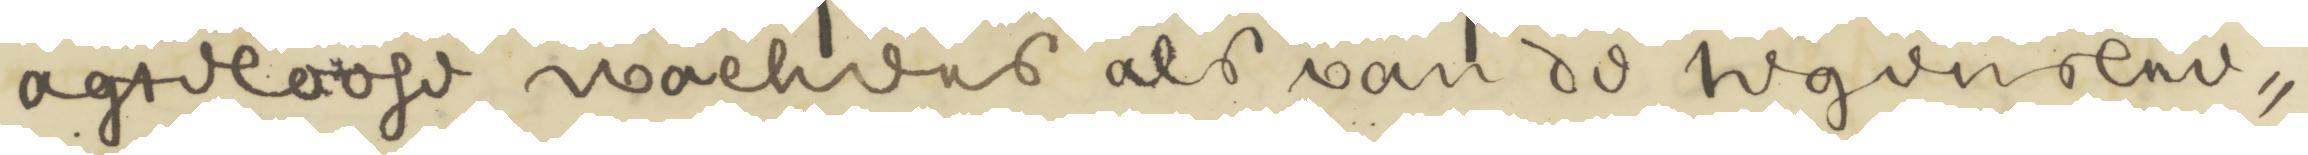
agteloose waekers als van de tegenstre„
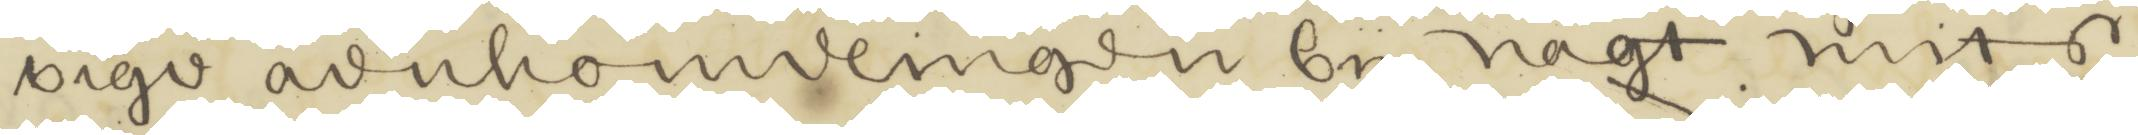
vige aenkomelingen bij nagt mits
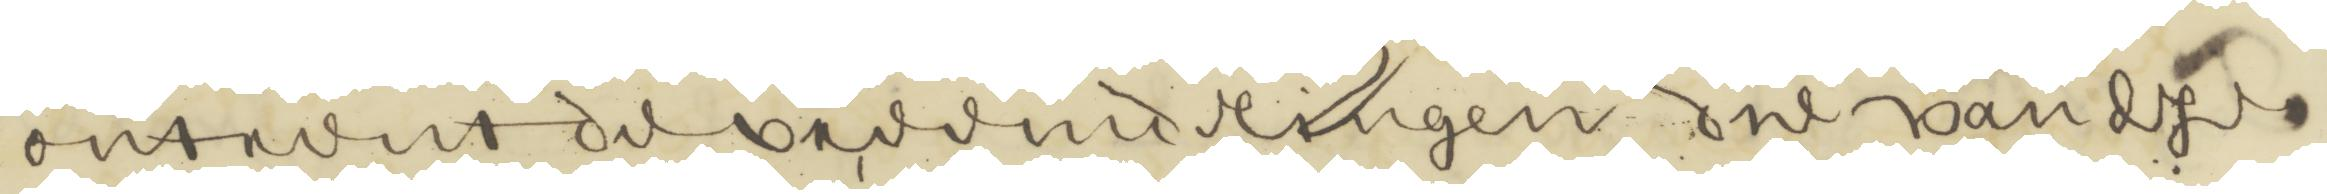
ontrent de vreemdelingen die van dese
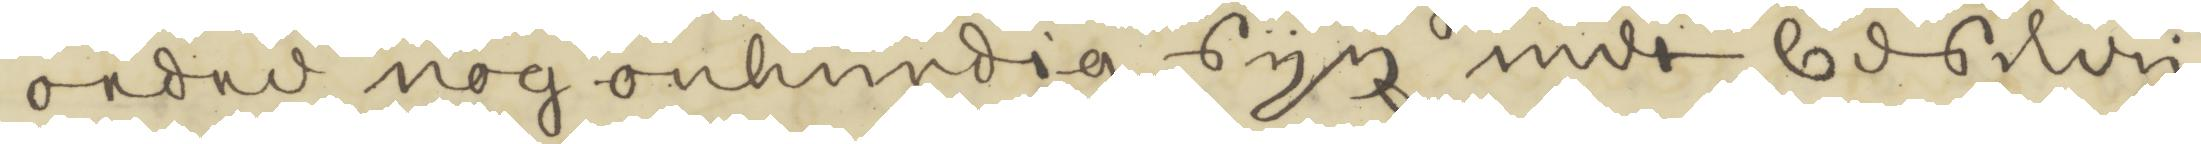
ordre nog onkundig sijn met bescheij
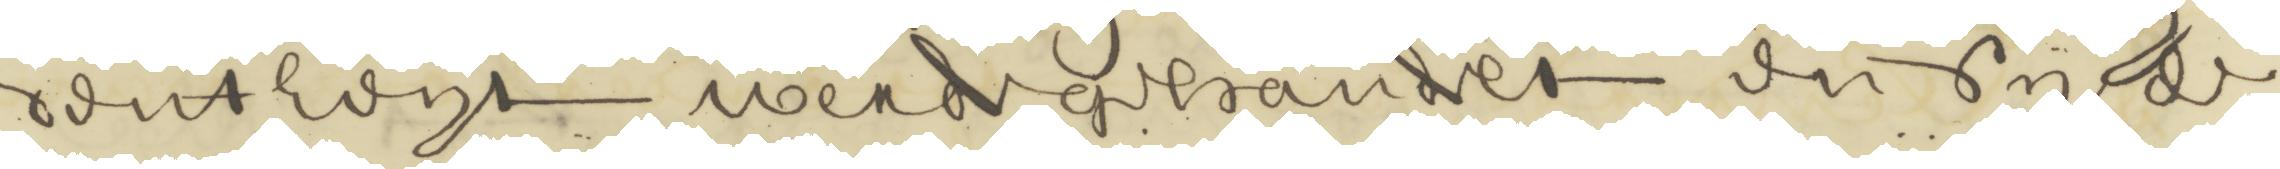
dentheijt, werde gehandelt en sijde
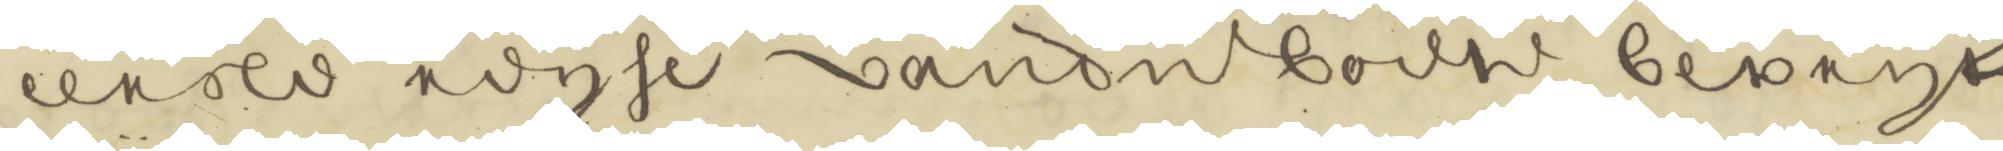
eerste reijse van die boete bevrijt
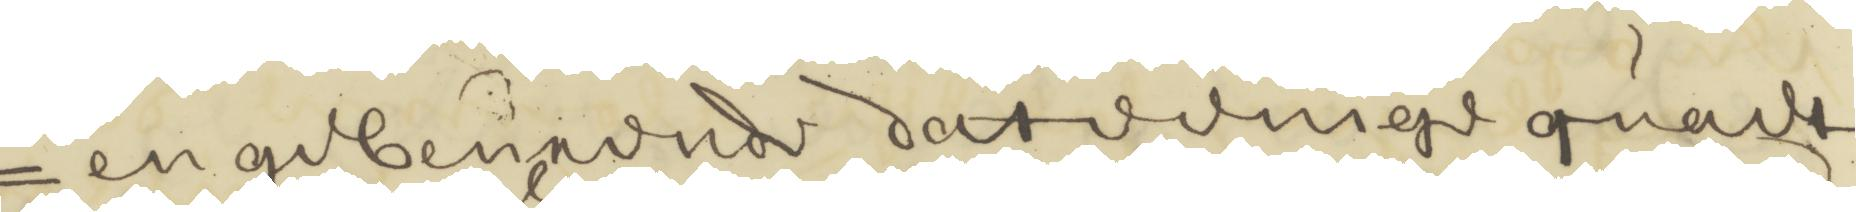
en gebeurende dat eenige quaet
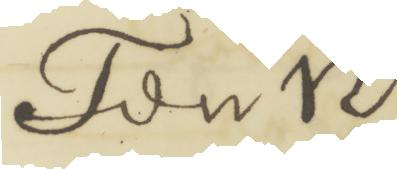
Ten 12=den
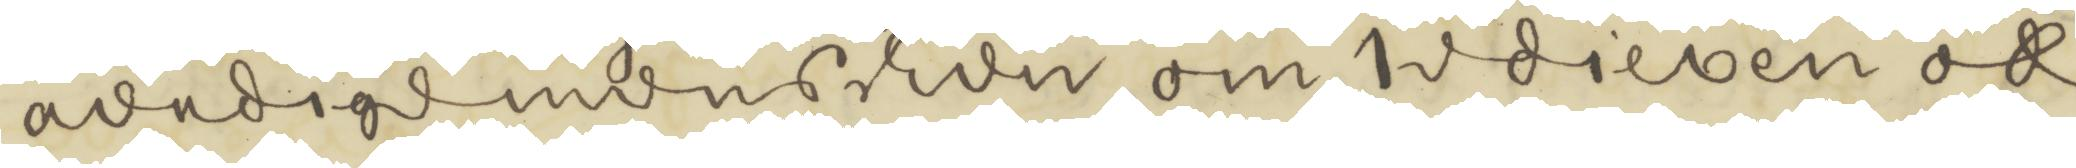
aerdige menschen om te dieven of
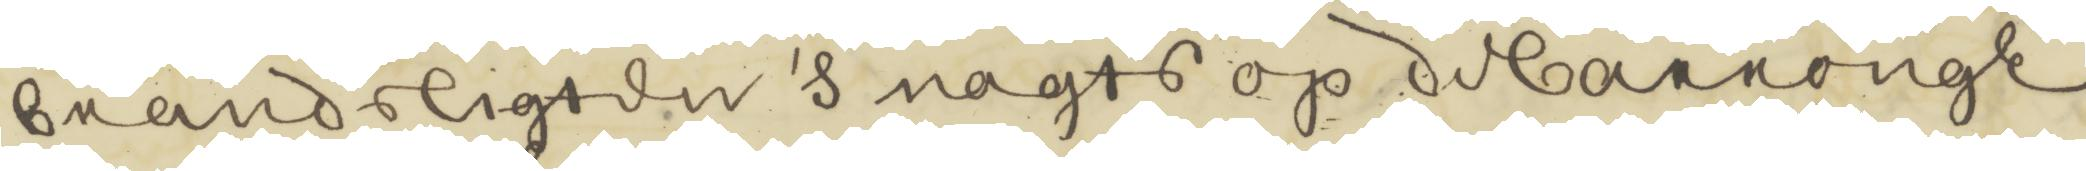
brandstigten ’s nagts op de barrongh
